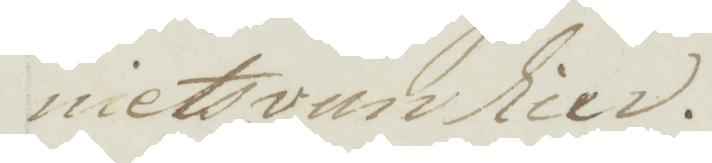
niets van hier.
